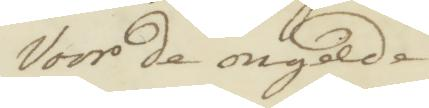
voor de ongelde
